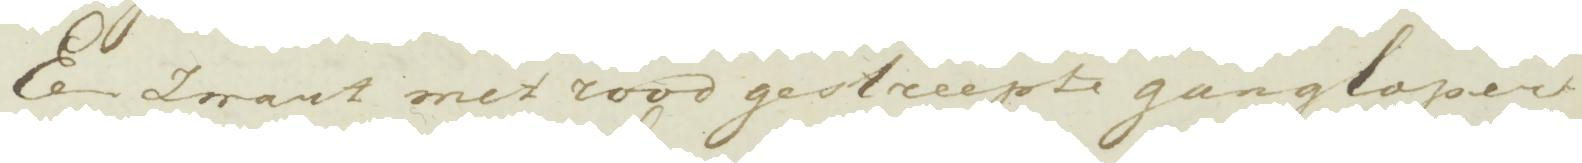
Een zwart met rood gestreepte gangloper
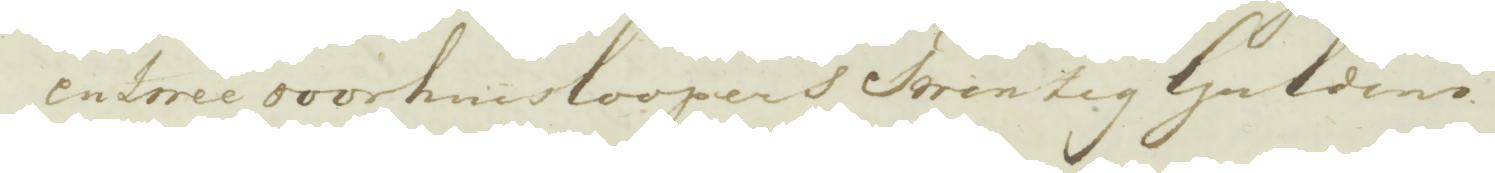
en twee voorhuisloopers Twintig Guldens.
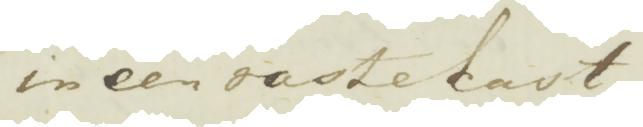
in een vaste kast
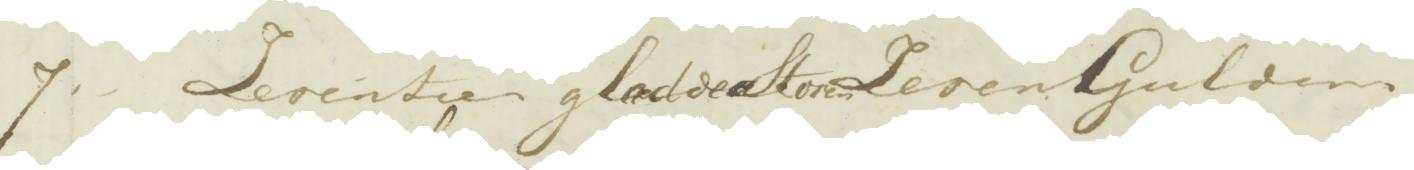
7„ Zeventien gladde stoven Zeven Guldens
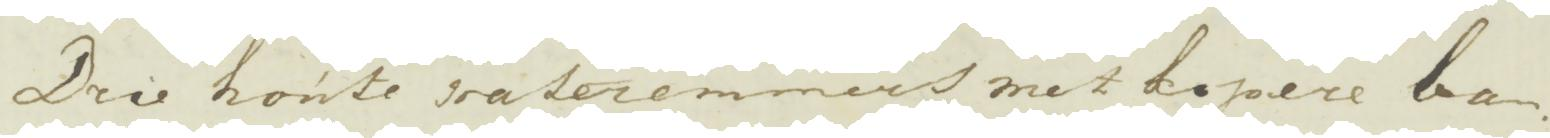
Drie houte wateremmers met kopere ban.
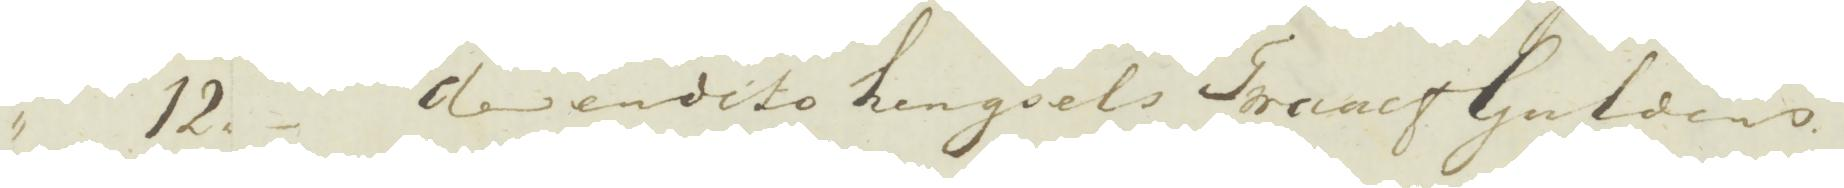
„ 12„ — den en dito hengsels Twaalf Guldens.
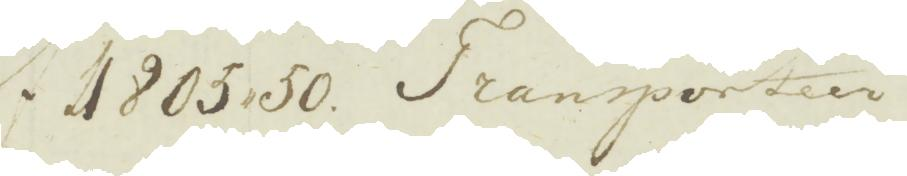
ƒ 4805„50. Transporteer.
